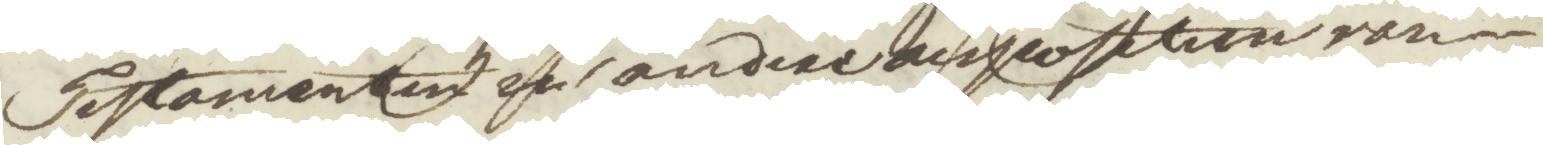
Testamenten en andere dispositien van
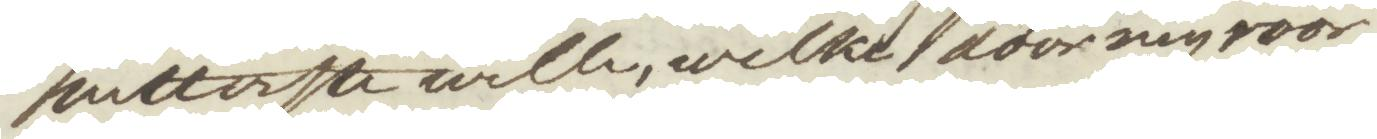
uitterste wille, welke door my voor
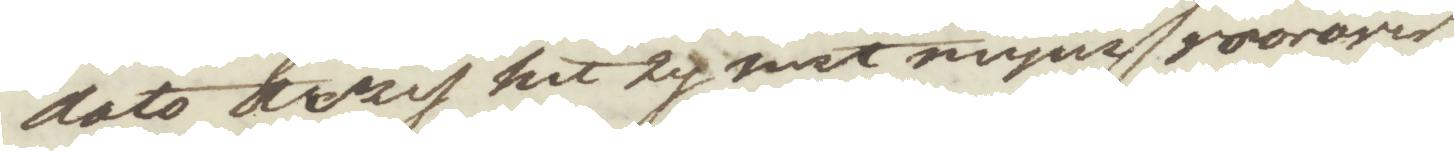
dato dezes het zy met myne voorover
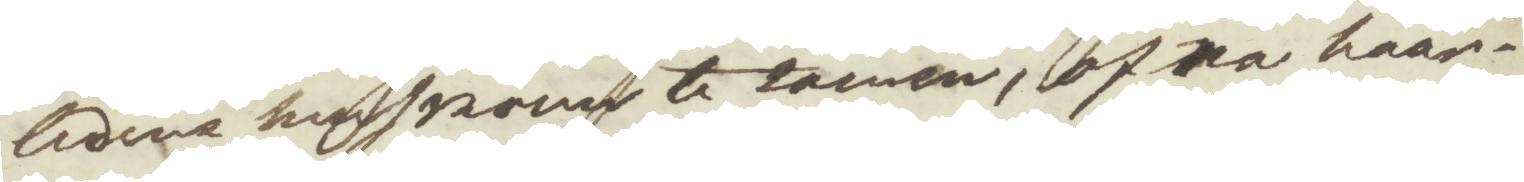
ledene huisvrouw te zamen, of na haar
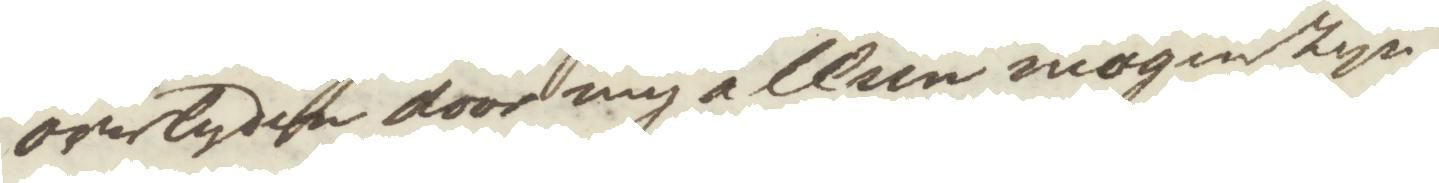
overlyden door my alleen mogen zyn
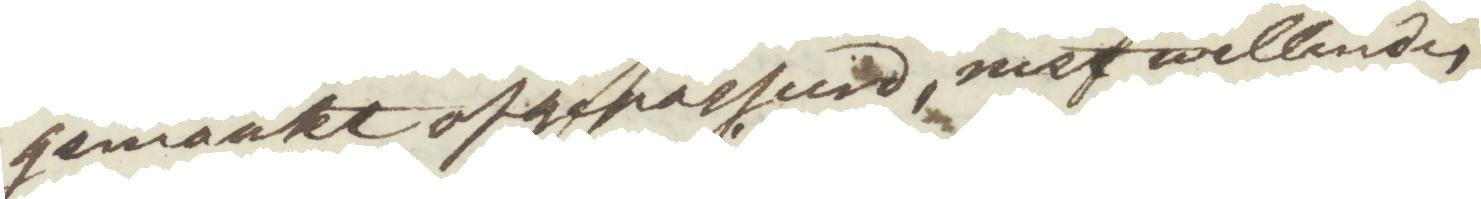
gemaakt of gepasseerd, niet willende,
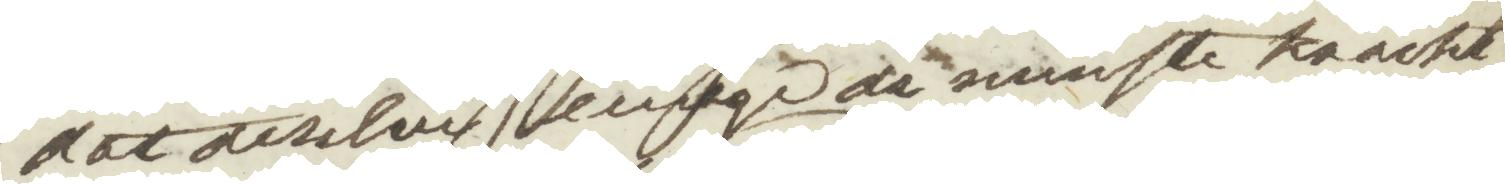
dat dezelve enige de minste kracht
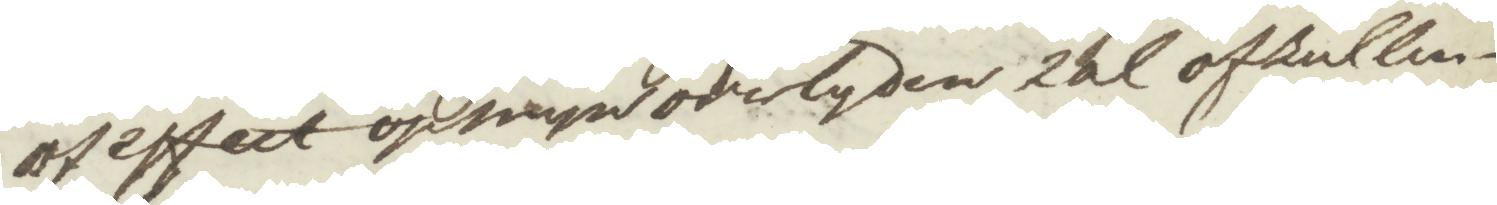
of effect op myn overlyden zal of zullen
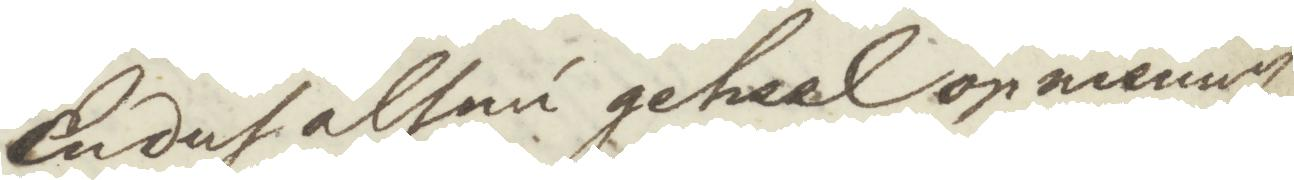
En dus alsnu geheel op nieuws
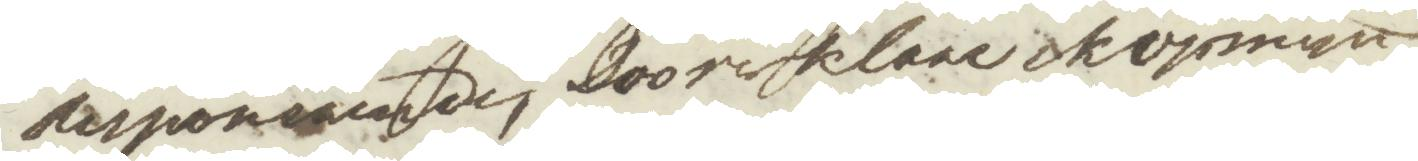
disponeerde, zoo verklare ik op myn
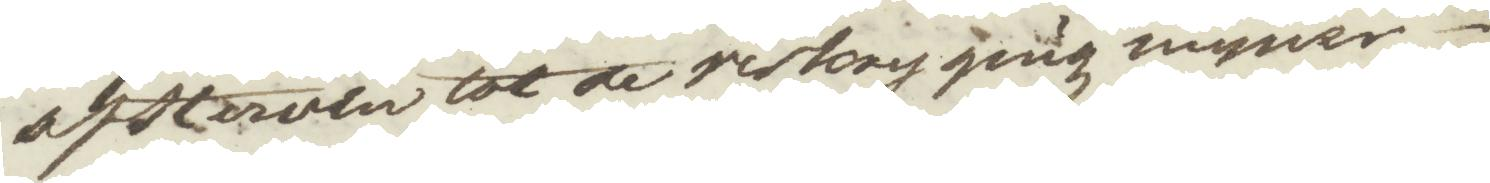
afsterven tot de verkryging myner
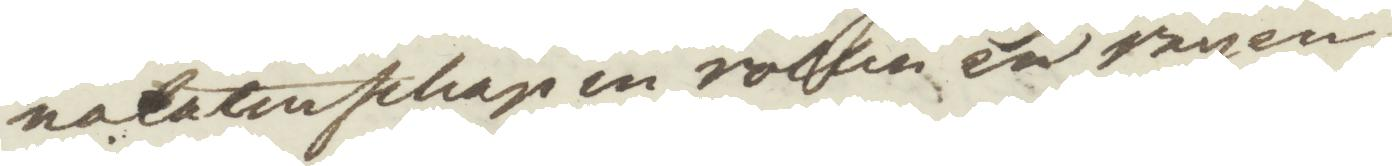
nalatenschap in vollen en vryen
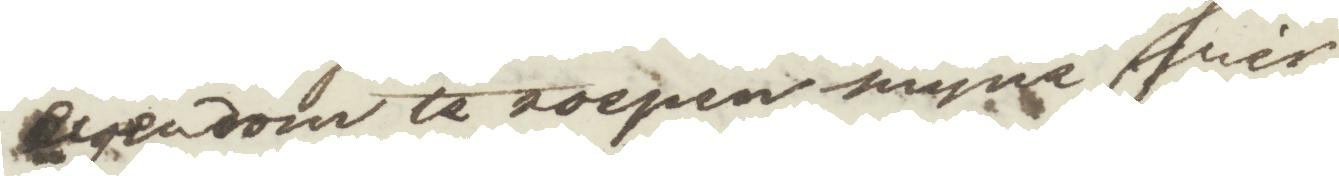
eigendom te roepen myne vier
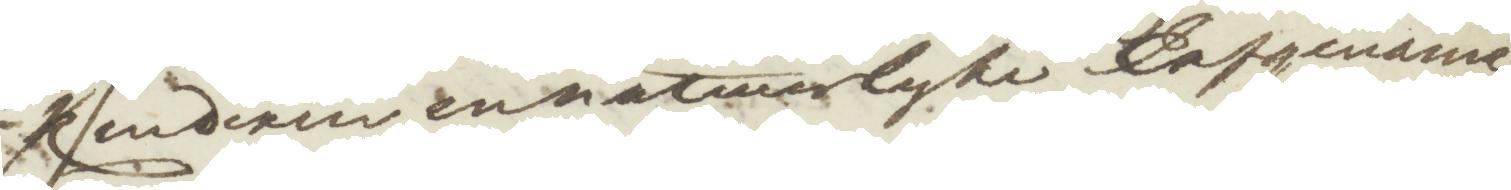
kinderen en natuurlyke Erfgenamen
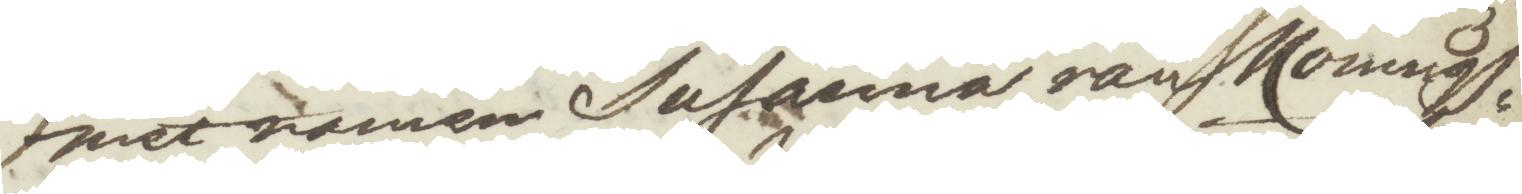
met namen Susanna van Konings„
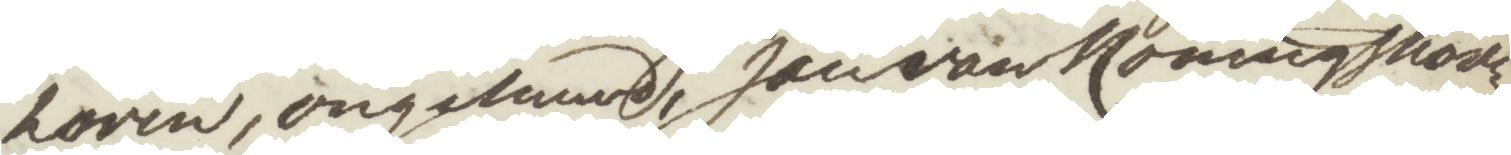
hoven, ongehuwd, Jan van Koningshoven
